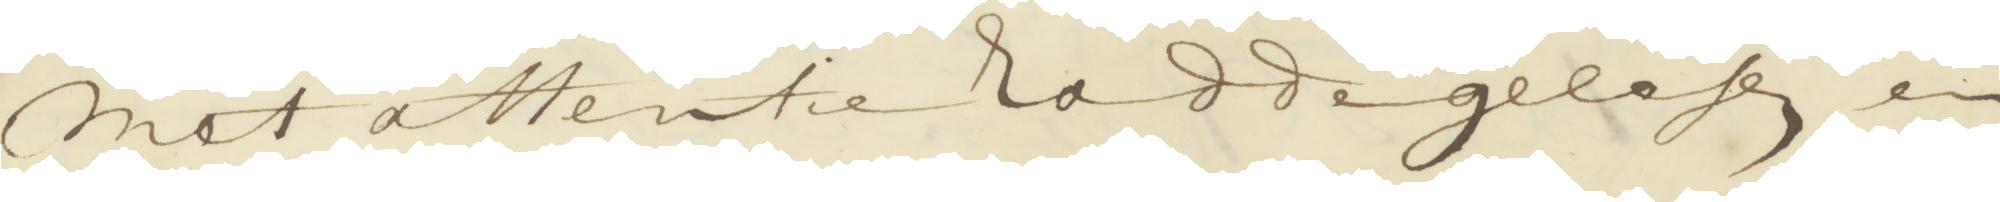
met attentie hadde gelesen en
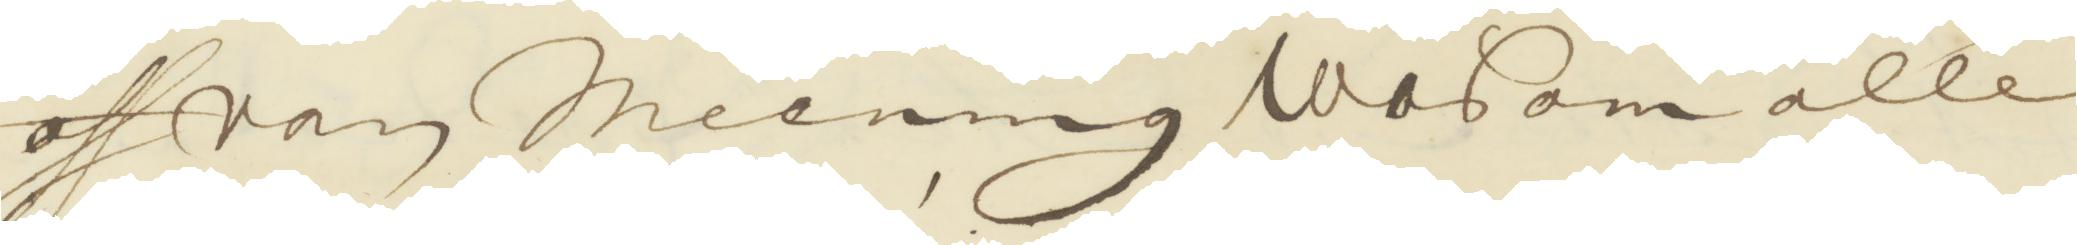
off van meening was om alle
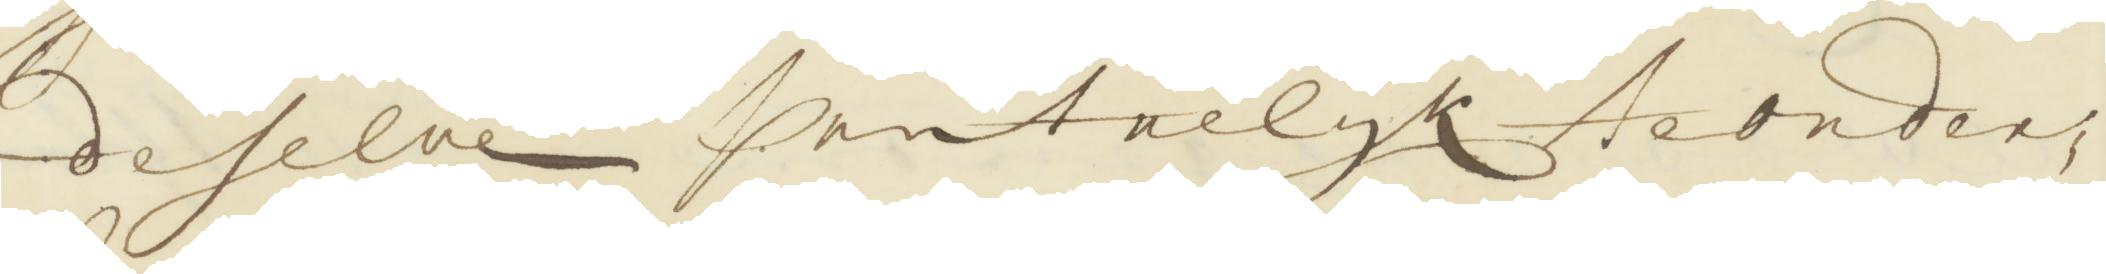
deselve puntuelijk te onder„
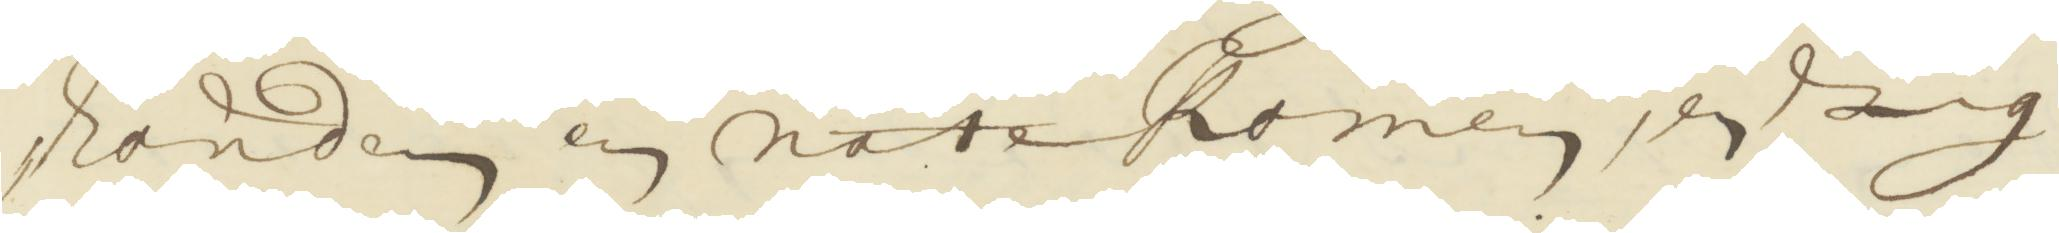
„houden en natekomen, en zig
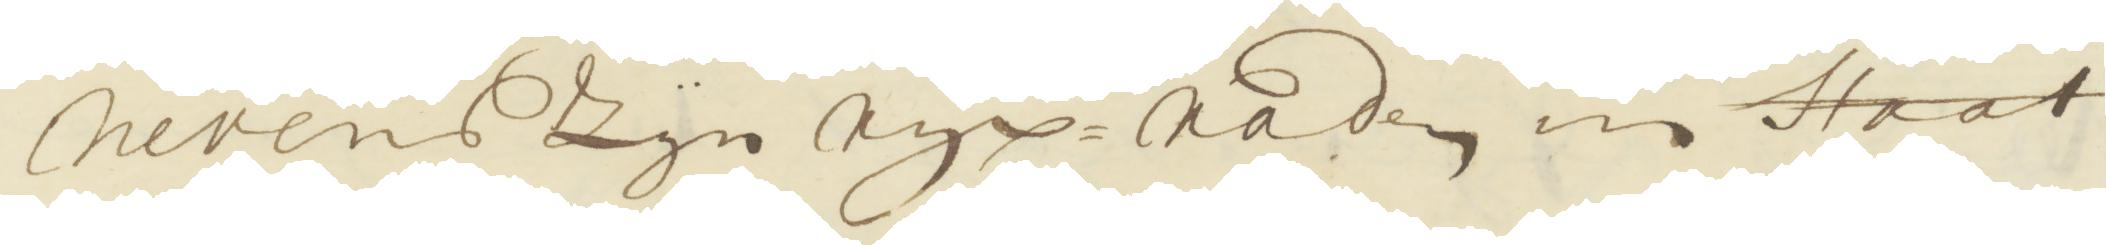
nevens zijn rijx=raden in staat
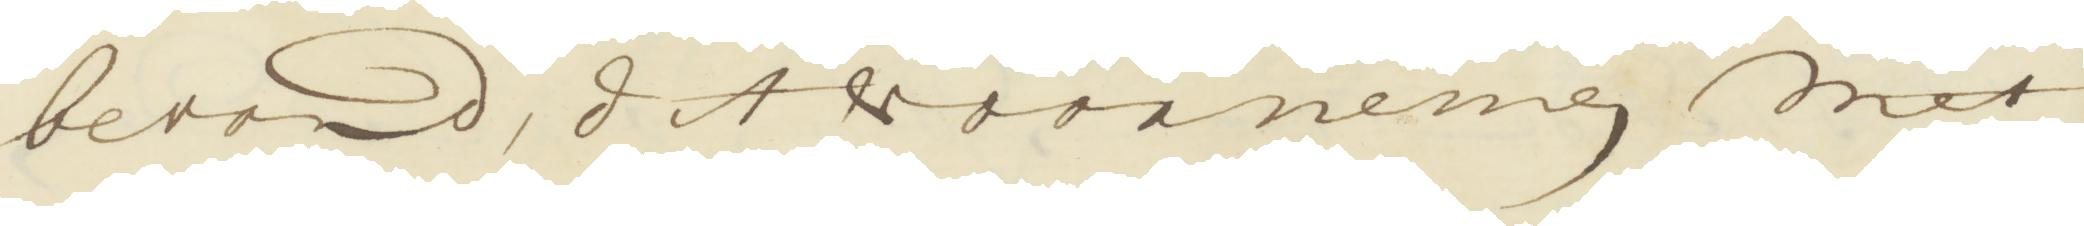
bevond, dit voornemen met
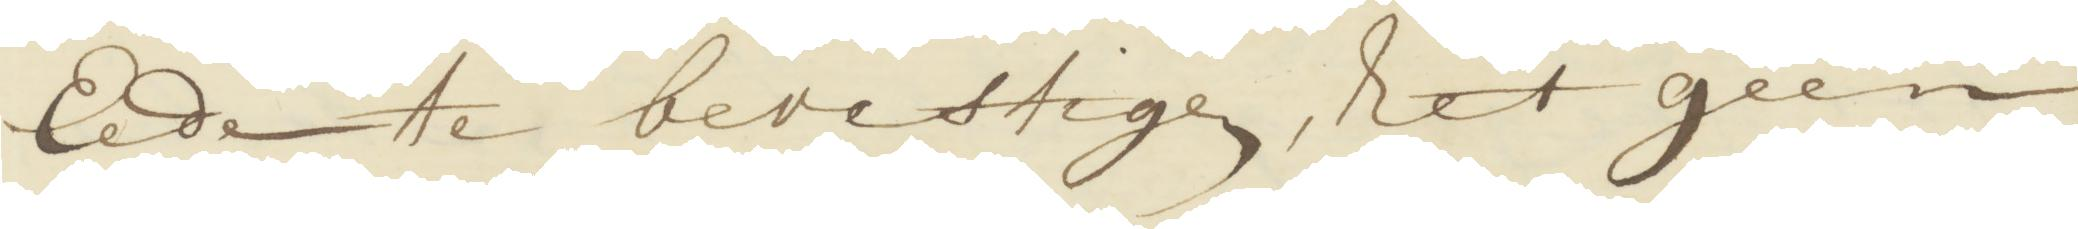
Eede te bevestigen, het geen
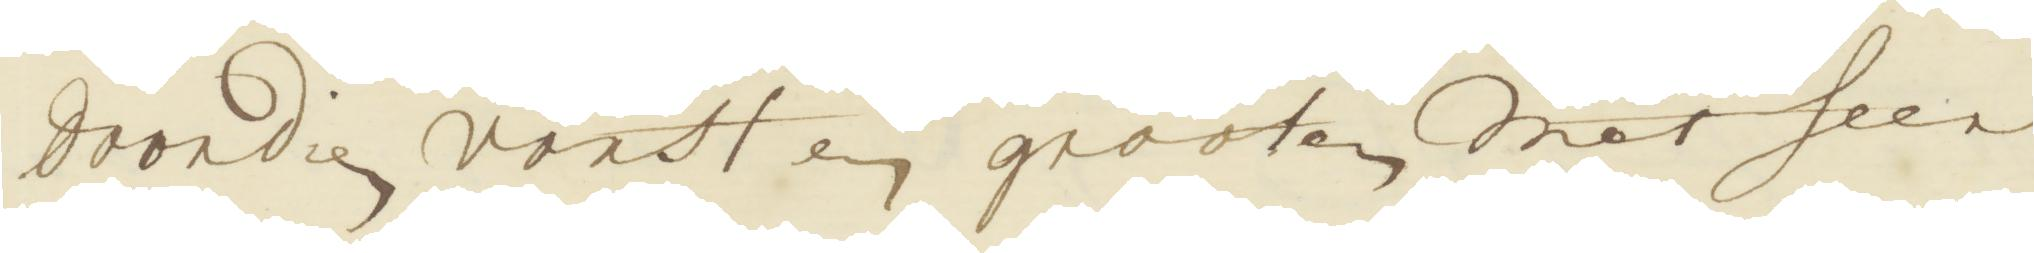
door dien vorsten groot en met seer
